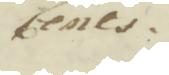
Cents .
